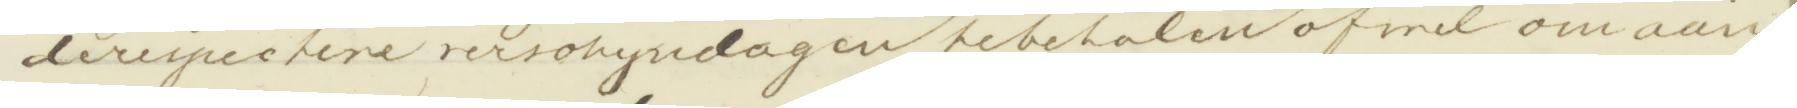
derespective verschyndagen tebetalen ofwel om aan
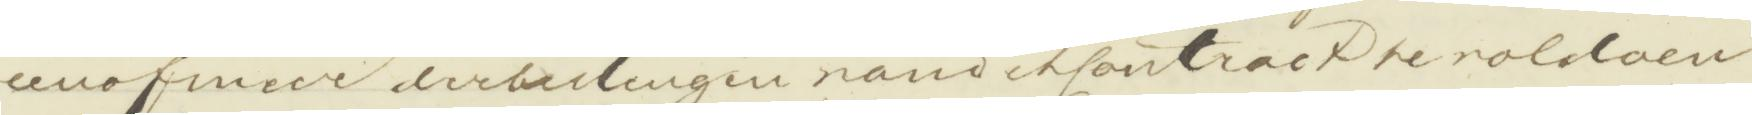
eenofmeer derbedingen vanditcontract te voldoen
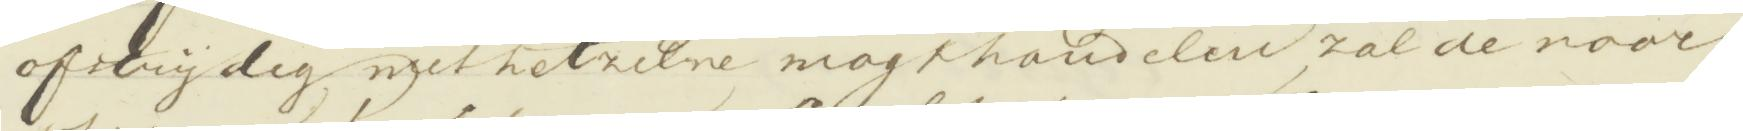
offstrijdig met hetzelve mogthandelen, zal de voor.
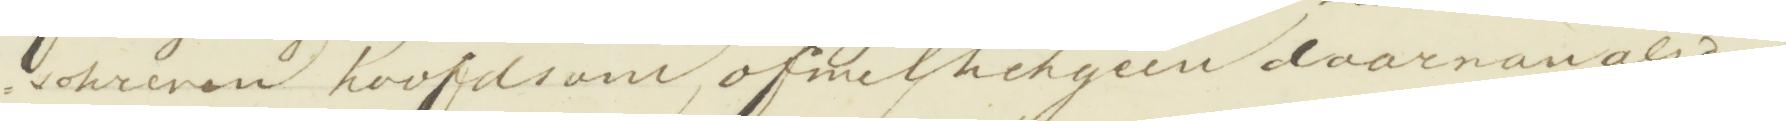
„schreven hoofdsom ofwelhetgeen daarvan alsdan
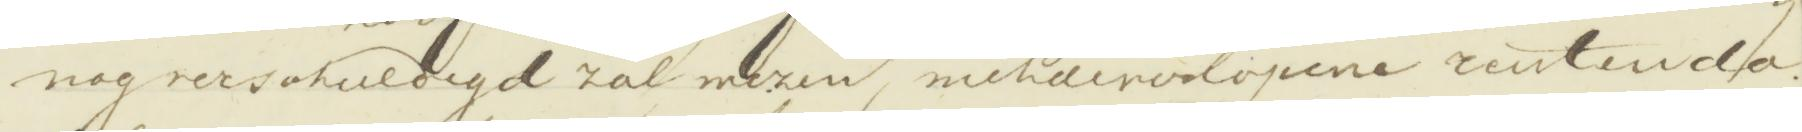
nogverschuldigd zal wezen, metdeverlopene resten da
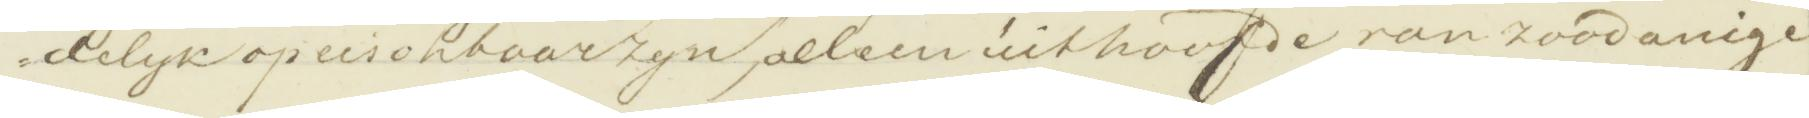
=delyk op eischbaar zyn, alleen uithoofde van zoodanige
